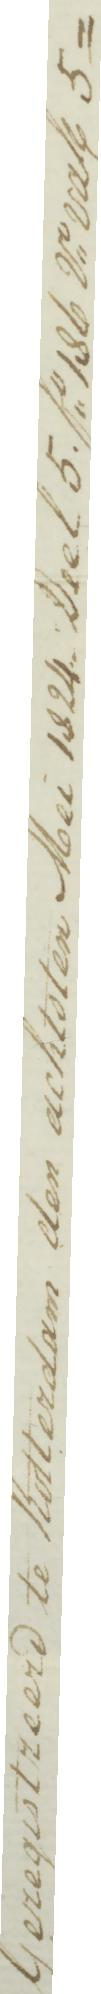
Geregistreerd te Rotterdam den achtsten Mei 1824 Deel 5. f„o 186 v„o vak 5=
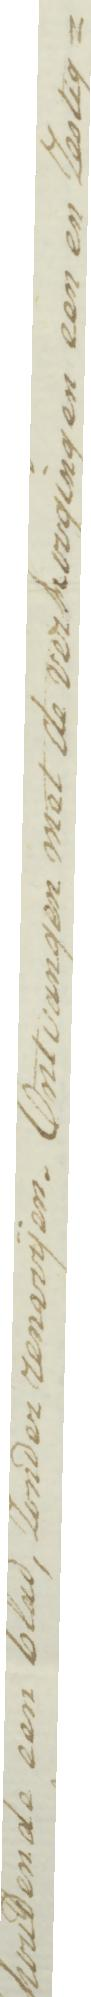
houdende een blad, zonder renvoijen. Ontvangen met de verhoogingen een en Zestig=
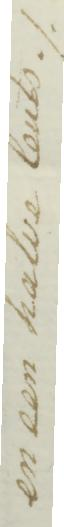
en een halve cents ./.
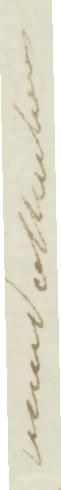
van Vollenhoven
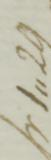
fr 1„29
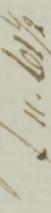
ƒ 11. 61½
